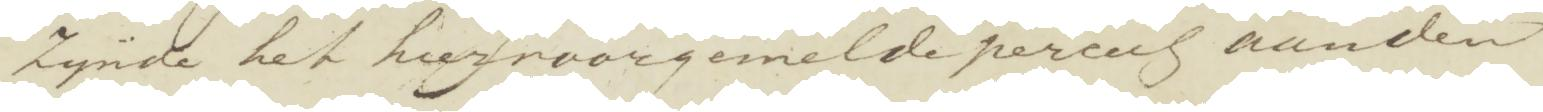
Zijnde het hiervoorgemelde perceel aan den
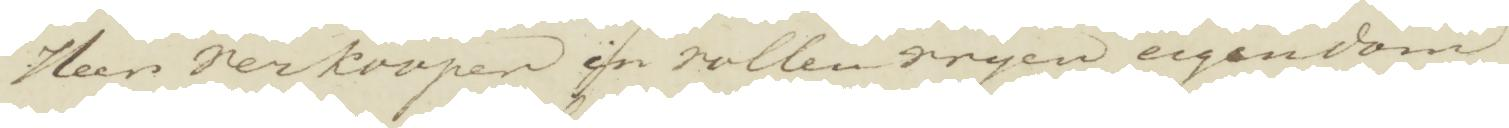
Heer verkooper in vollen vrijen eigendom
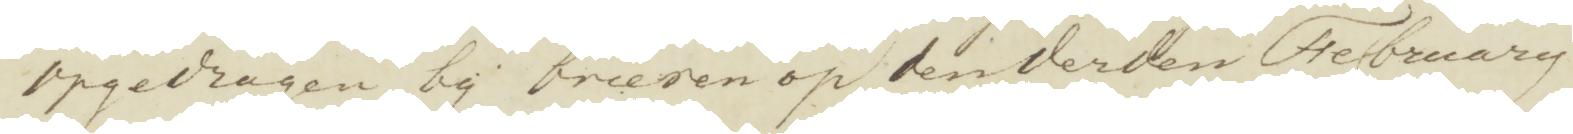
opgedragen bij brieven op den derden Februarij
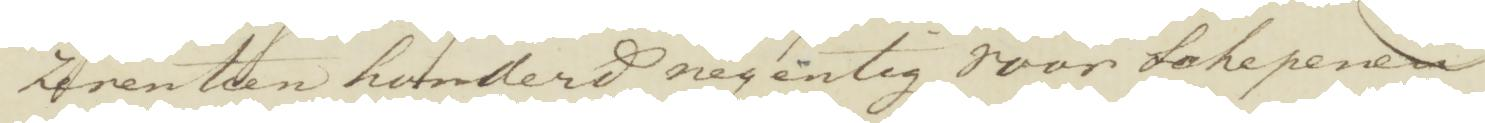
zeventien honderd negentig voor schepenen
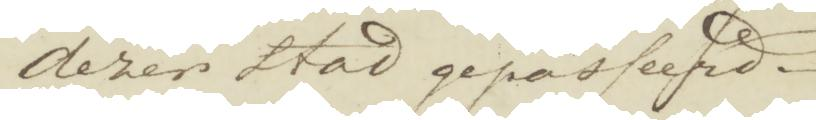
dezer stad gepasseerd.
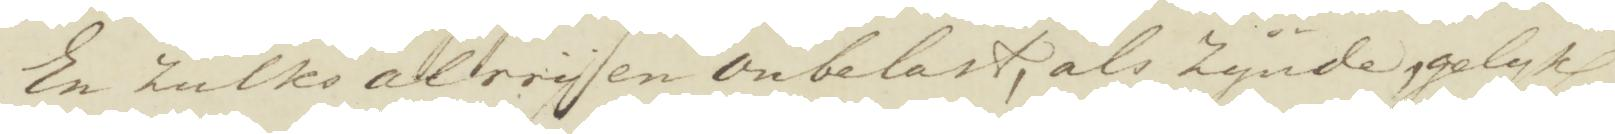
En zulks al vrij en onbelast, als zijnde, gelyk
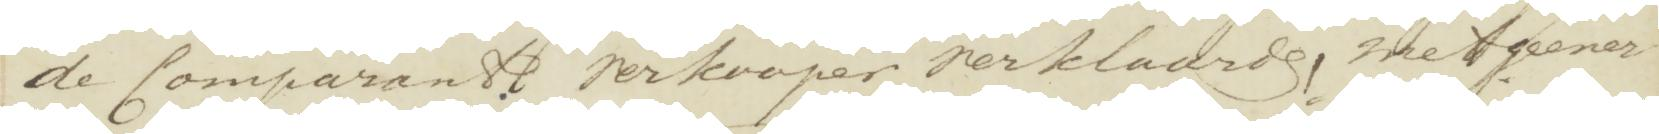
de Comparant. verkooper verklaarde, met geener
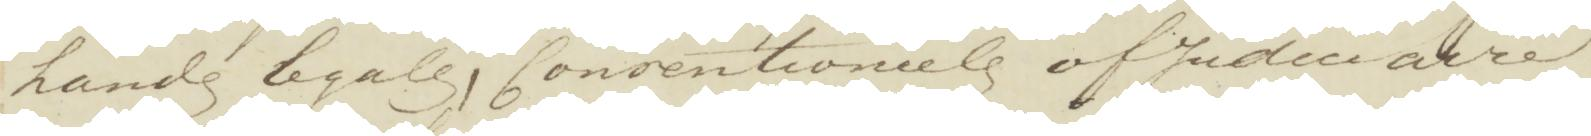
hande legale, Conventioneele of Judiciaire
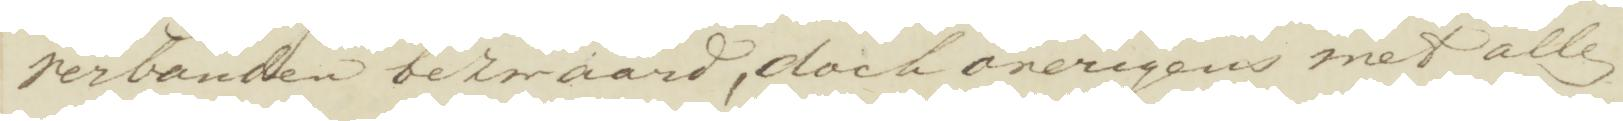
verbanden bezwaard, doch overigens met alle
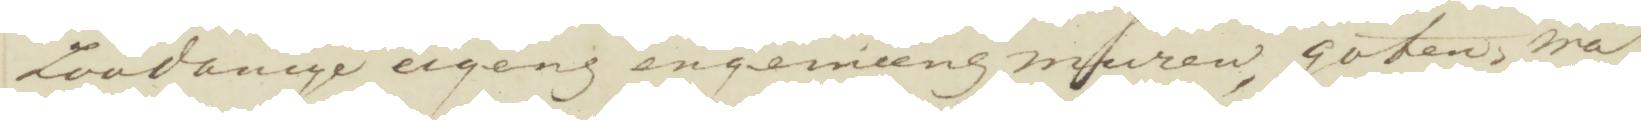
zoodanige eigene en gemeene muren, goten, wa
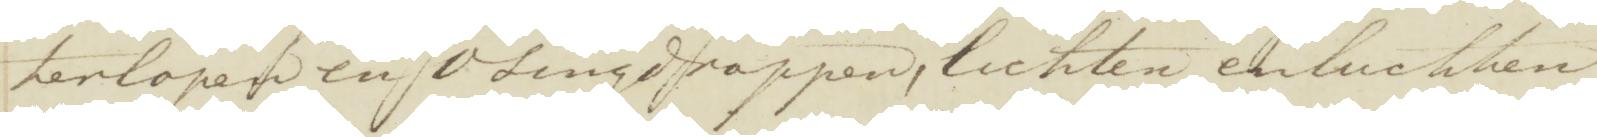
terlopen en Osingdroppen, lichten en luchten
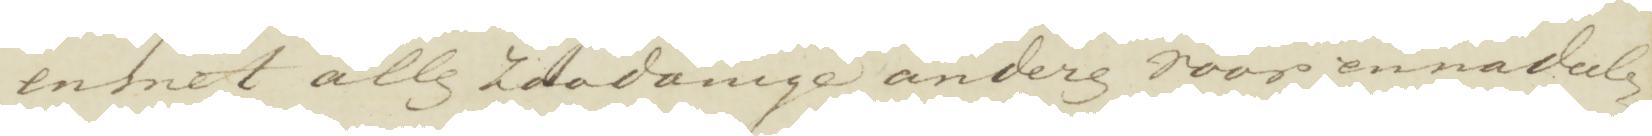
en met alle zoodanige andere voor en nadeele
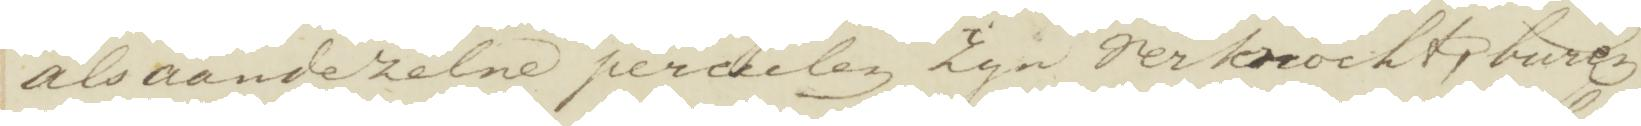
als aan dezelve perceelen zijn verkrocht, buren
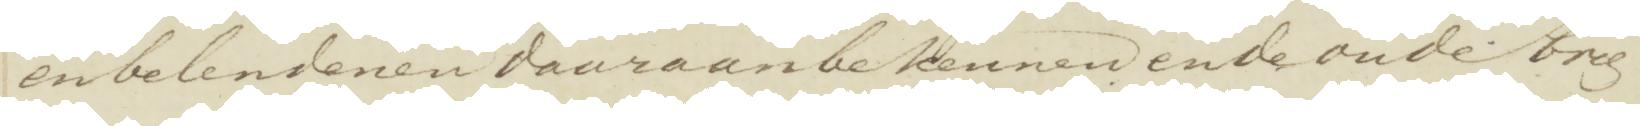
en belendenen daaraan bekennen ende oude brie
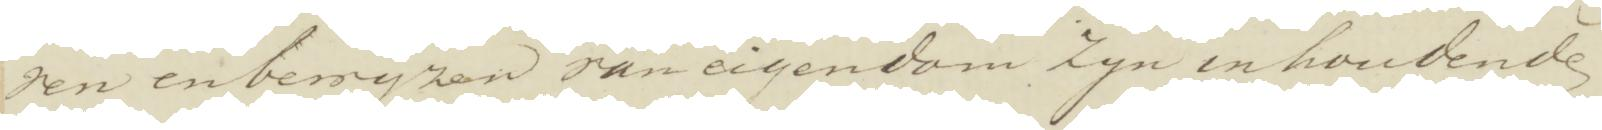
ven en bewijzen van eigendom zyn inhoudende
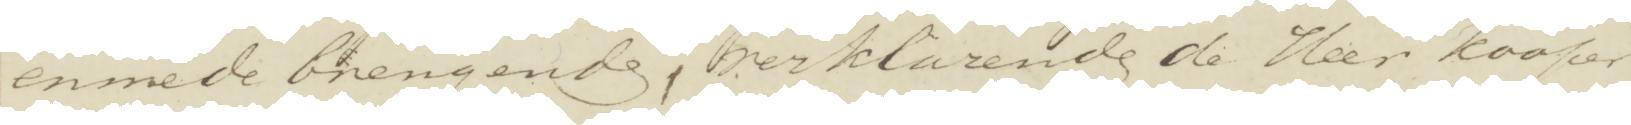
en mede brengende, verklarende de Heer kooper
